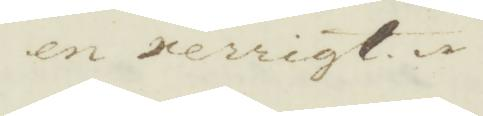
en verrigt. ~
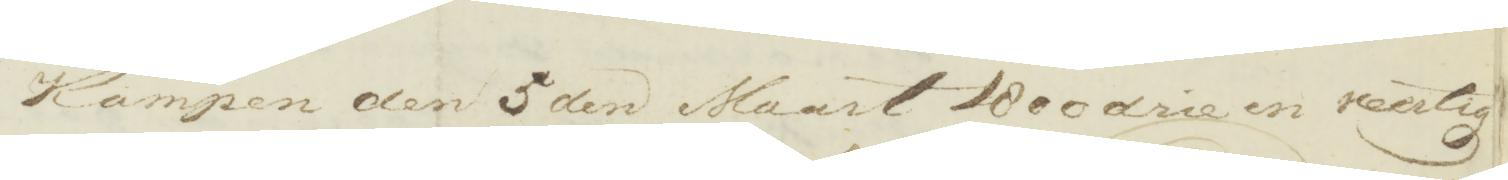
Kampen den 5 den Maart 1800 drie en veertig
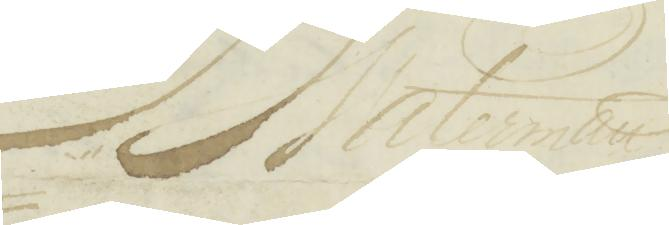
J Waterman
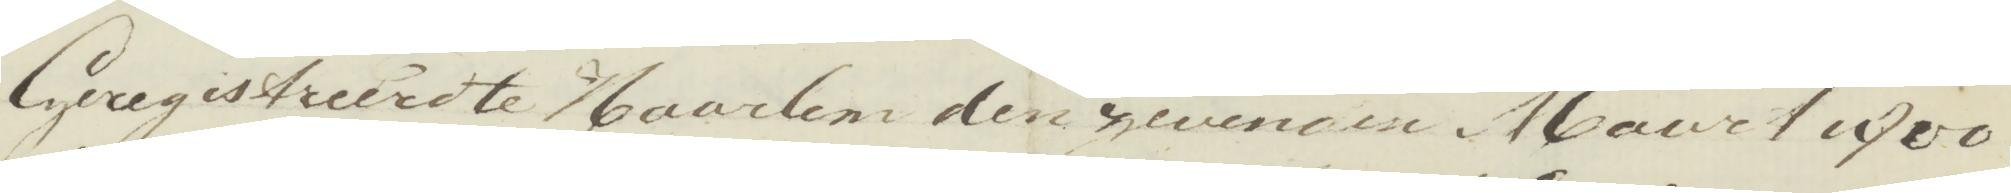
Geregistreerd te Haarlem den zevenden Maart 1800
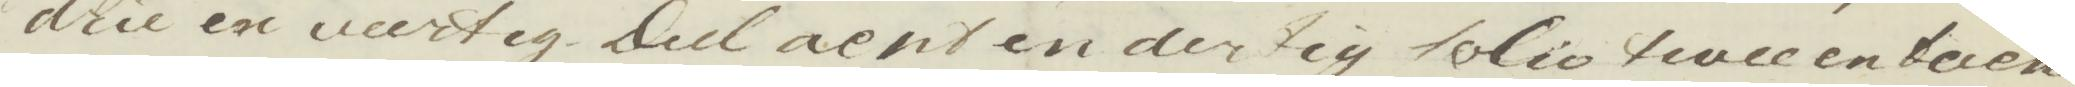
drie en veertig Deel acht en dertig folio twee en tach
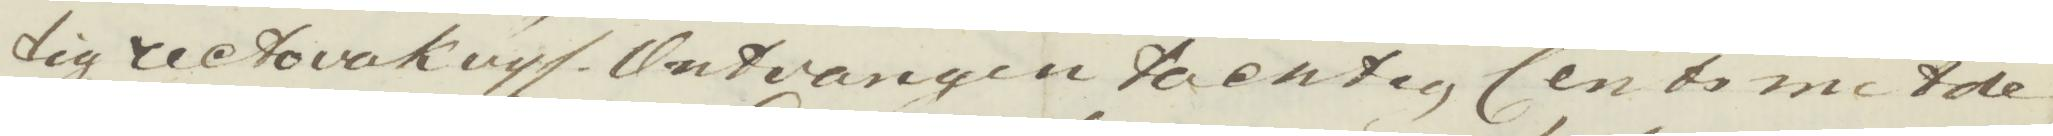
tig recto vak vyf. Ontvangen tachtig Cents met de
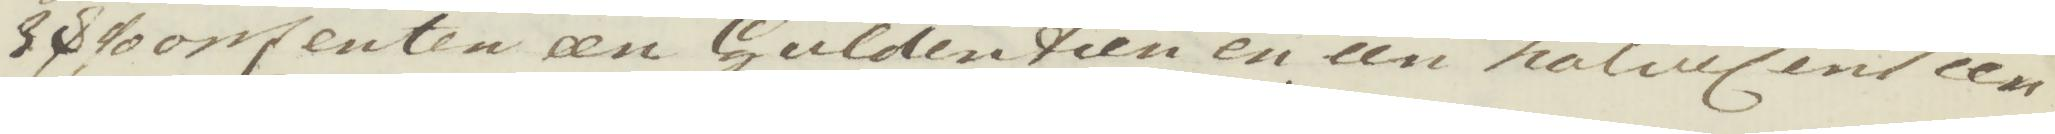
38% opcenten een Gulden tien en een halve Cent een
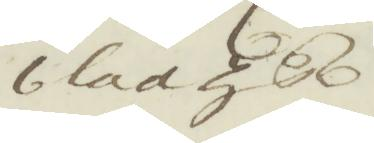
blad ZR
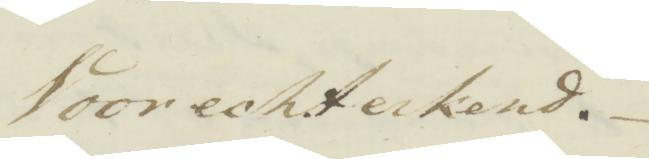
Voor echt erkend.—
